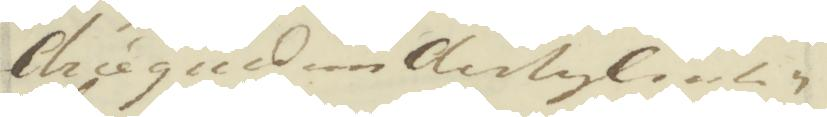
Drie guldens dertig Cent „
